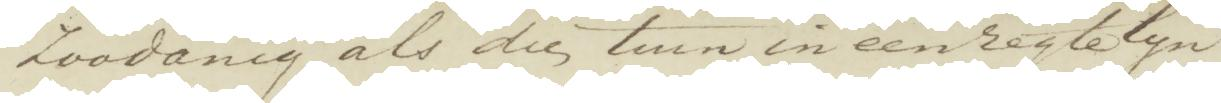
zoodanig als die tuin in een regte lijn
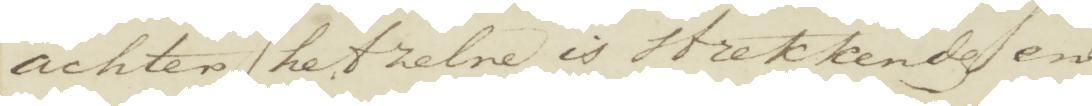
achter het zelve is strekkende en
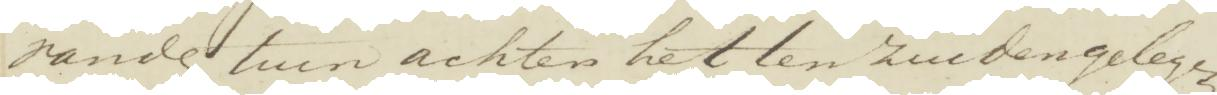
vande tuin achter het ten zuidengelegen
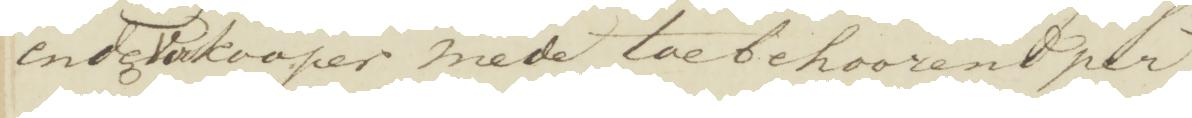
en den verkooper mede toebehoorend per
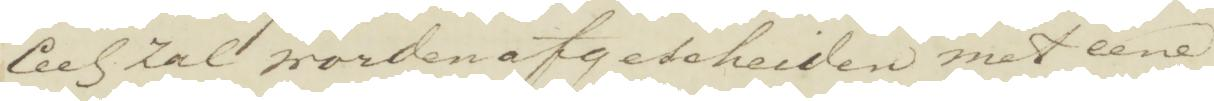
ceel zal worden afgescheiden met eene
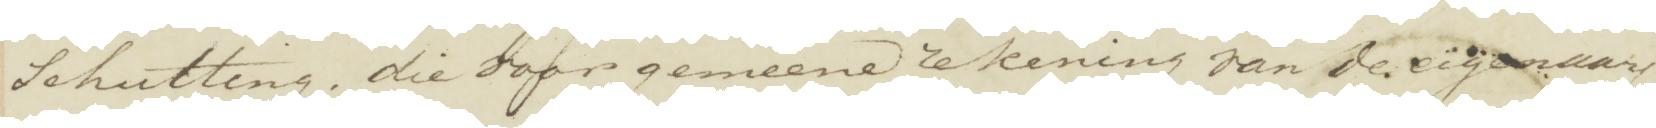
schutting, die voor gemeene rekening van de eigenaar
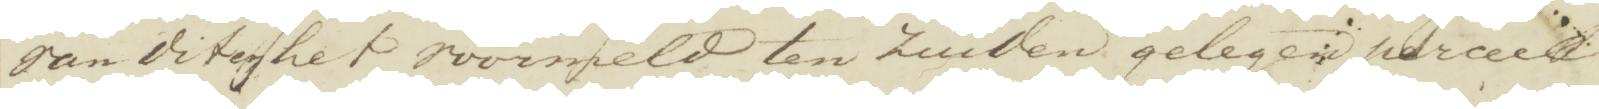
van dito het voormeld ten zuiden gelegen perceel
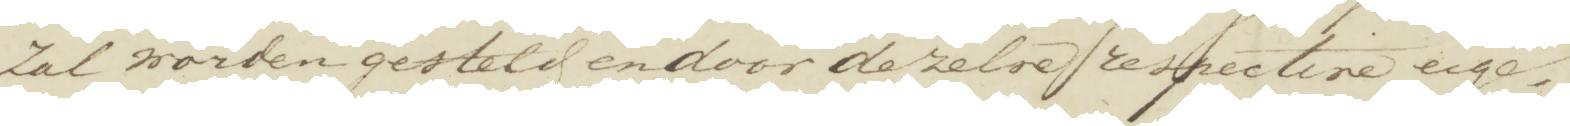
zal worden gesteld en door dezelve respective eige,
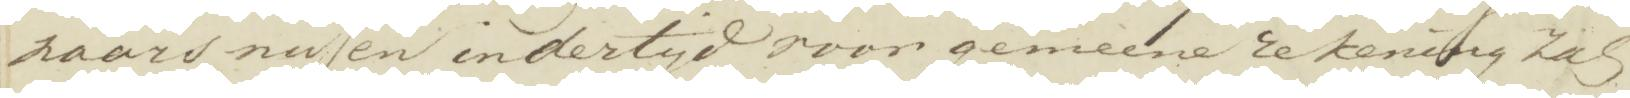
naars nu en indertijd voor gemeene rekening zal
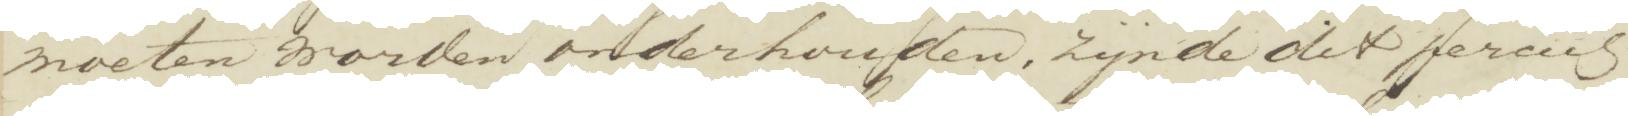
moeten worden onderhouden, zijnde dit perceel
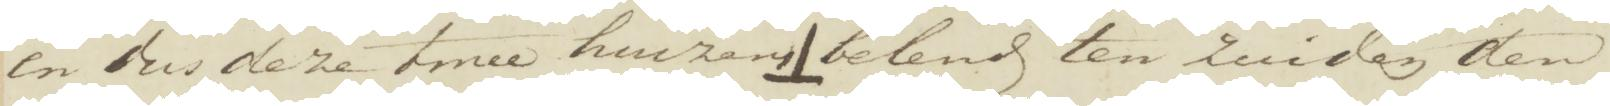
en dus deze twee huizen ¶ belend ten zuiden den
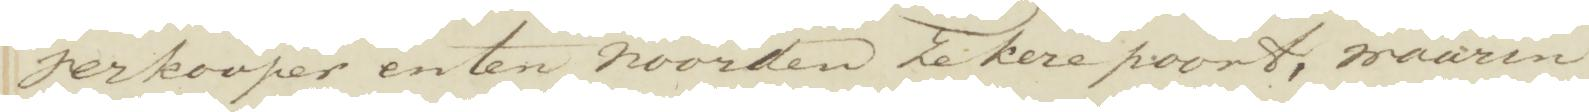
verkooper en ten noorden zekere poort, waarin
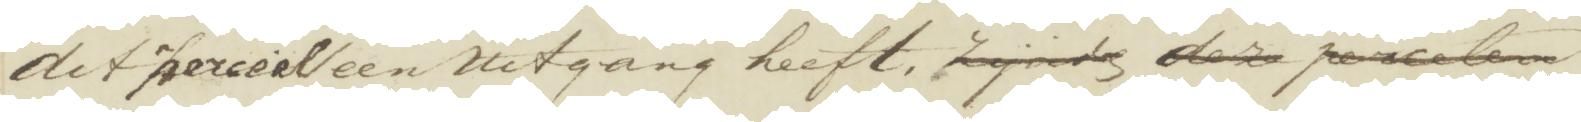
dit perceel een uitgang heeft, zijnde deze percelen
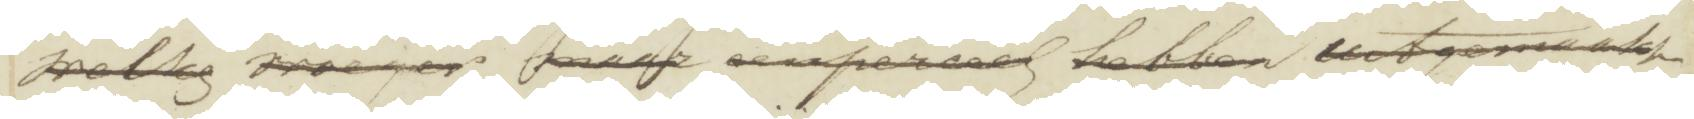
welke vroeger maar aenperceel hebben uitgemaakt
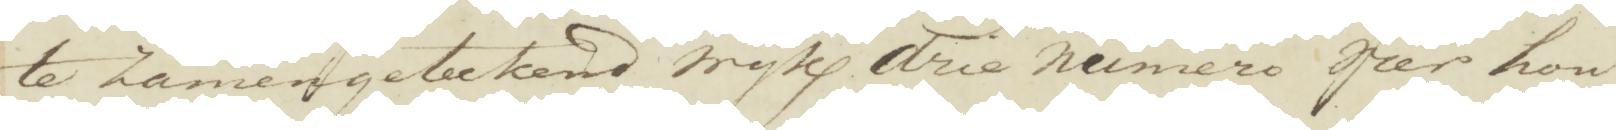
te zamen geteekend wijk drie numero vier hon
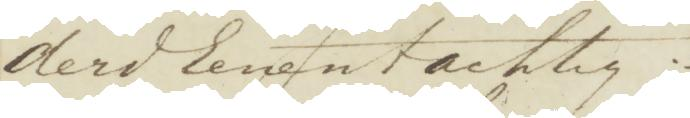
derd Eenen tachtig.
